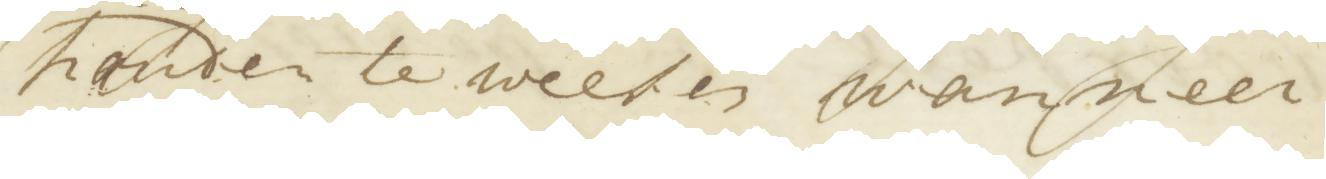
houden te weesen wanneer
